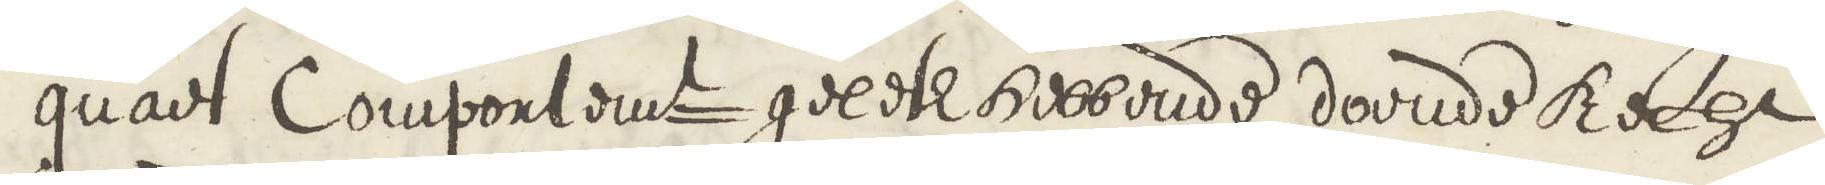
quaet Comportem=t geleth hebbende doende Recht
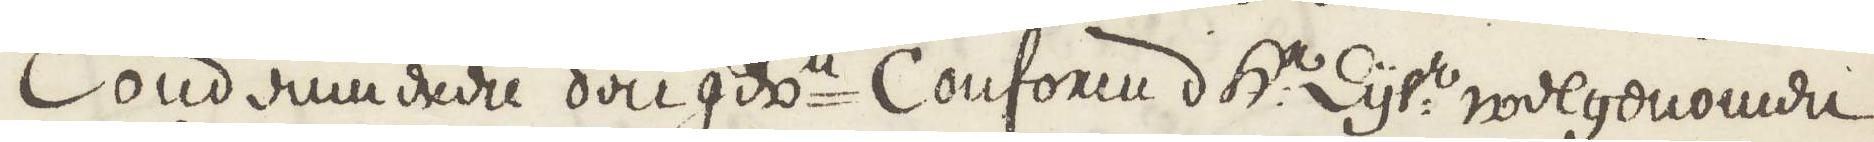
Condemneren den gev=n Conform d h:r Eijs:r wel genomen
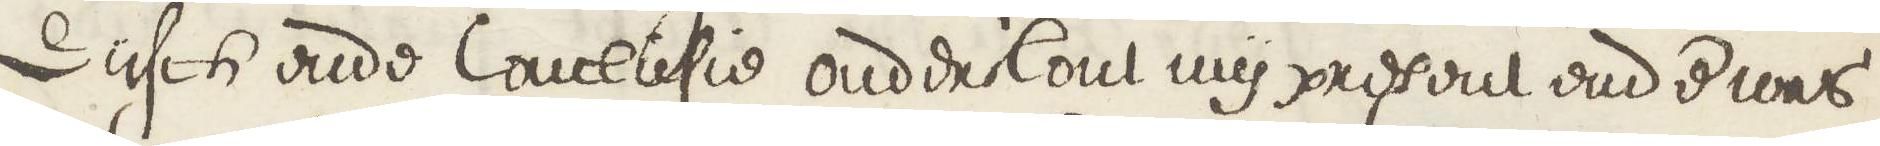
Eijsch ende Conclusie onderstont mij present ende was
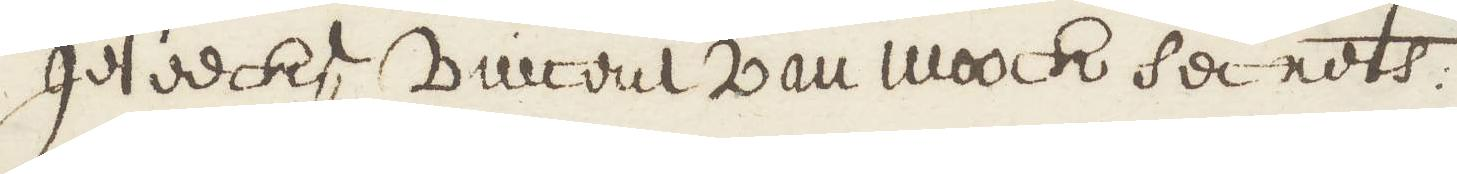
geteeck„t Vincent van Moock secrets:
